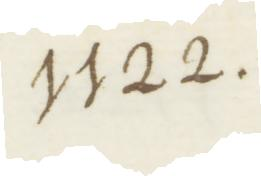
1122.
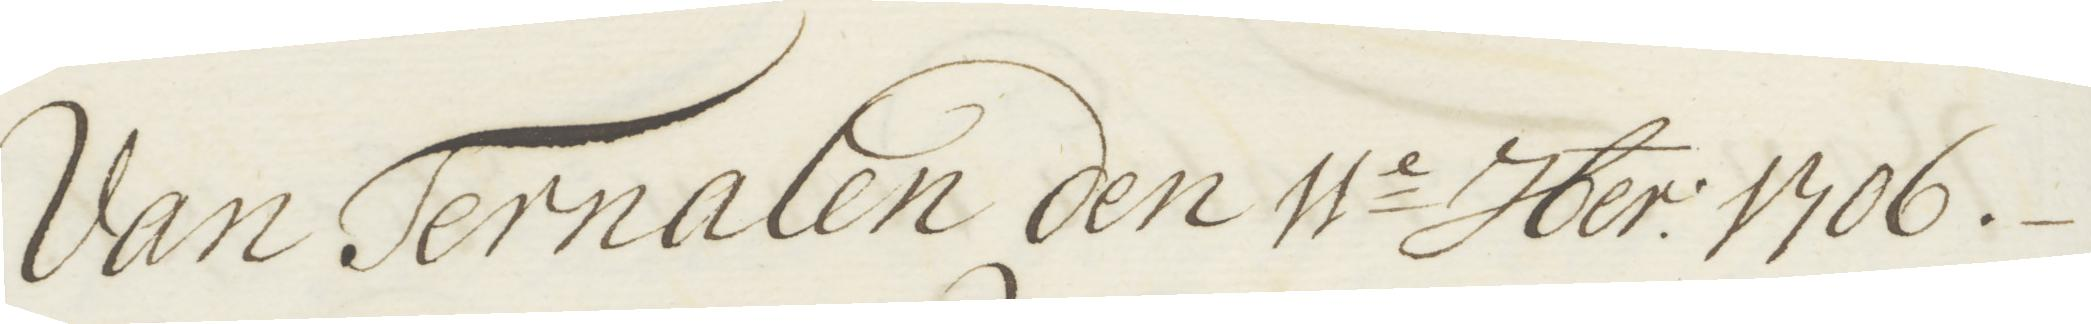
Van Ternaten den 11=e Jber: 1706.—
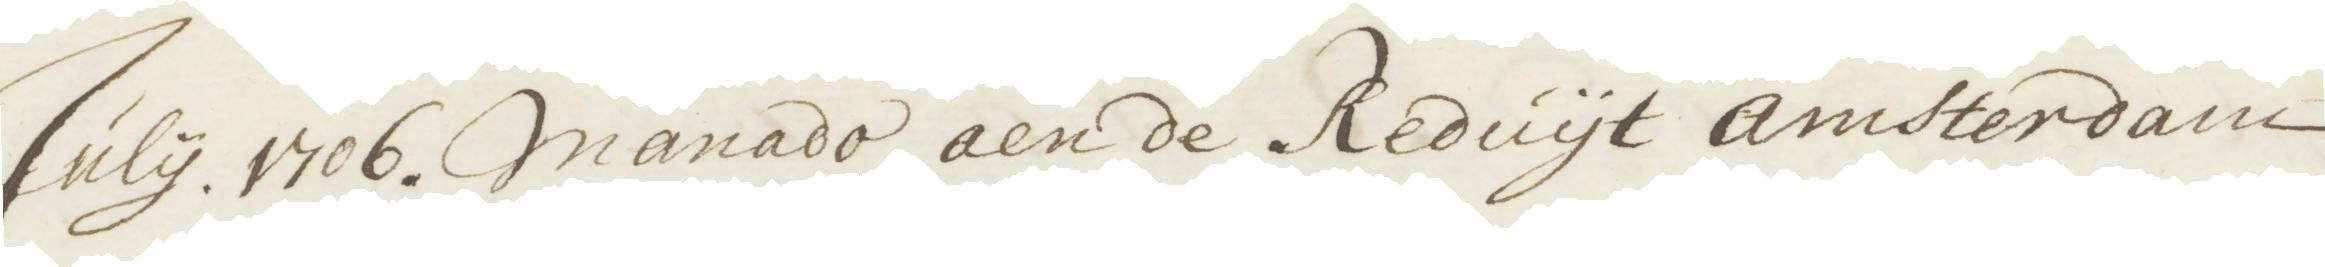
Julij. 1706. Manado aen de Reduijt amsterdam
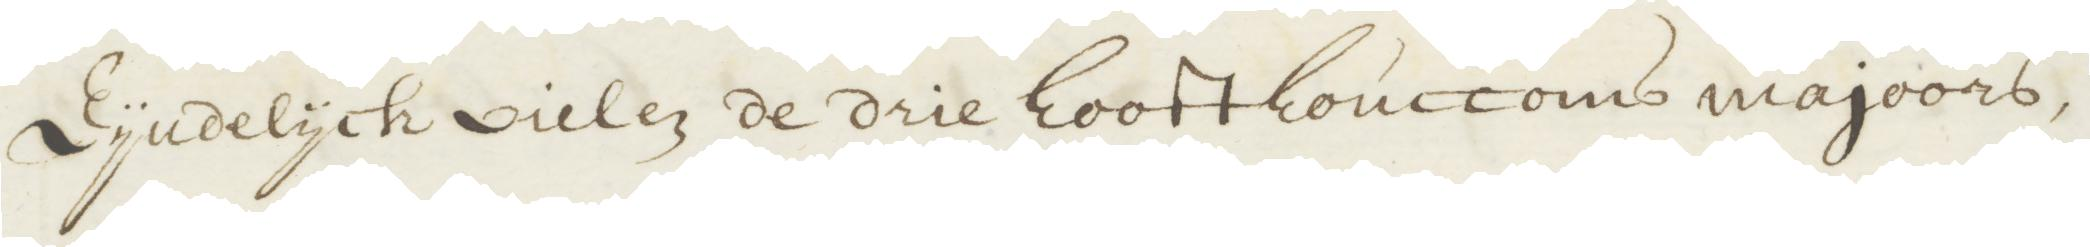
Eijndelijck vielen de drie hoofthouccoms majoors,
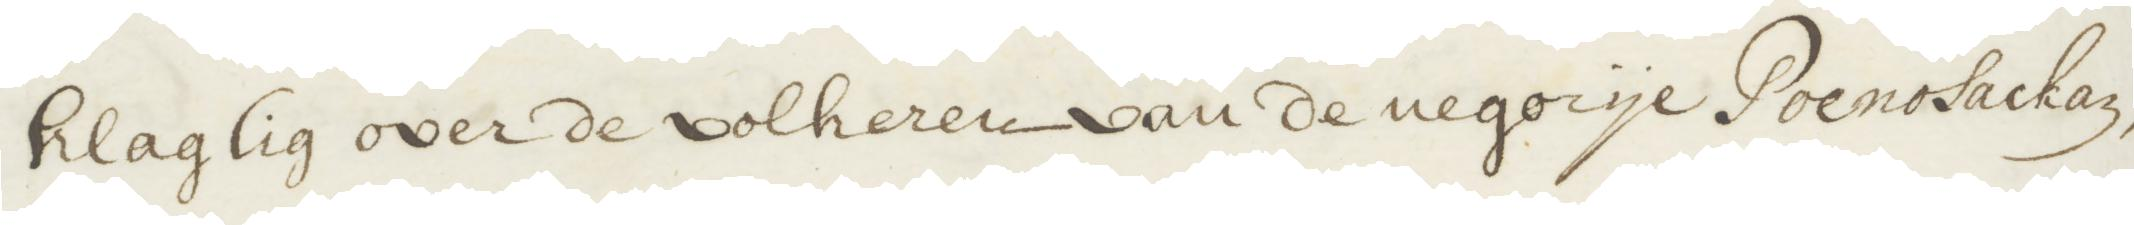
klagtig over de volkeren van de negorije Poenosackan,
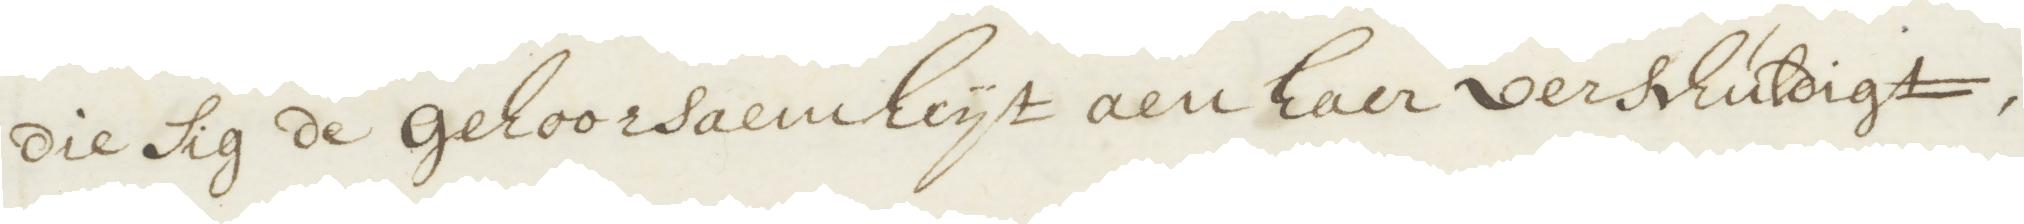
die sig de gehoorsaemheijt aen haer verschuldigt,
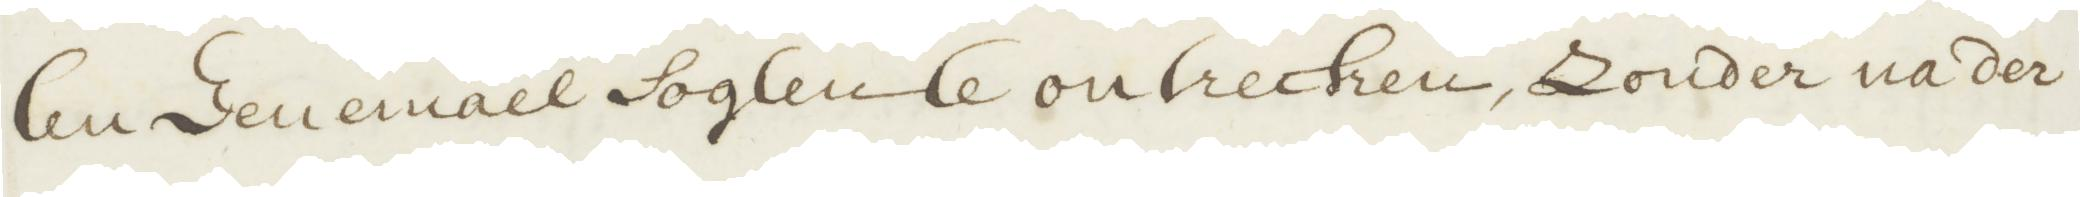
ten Eenemael sogten te ontrecken, zonder na der
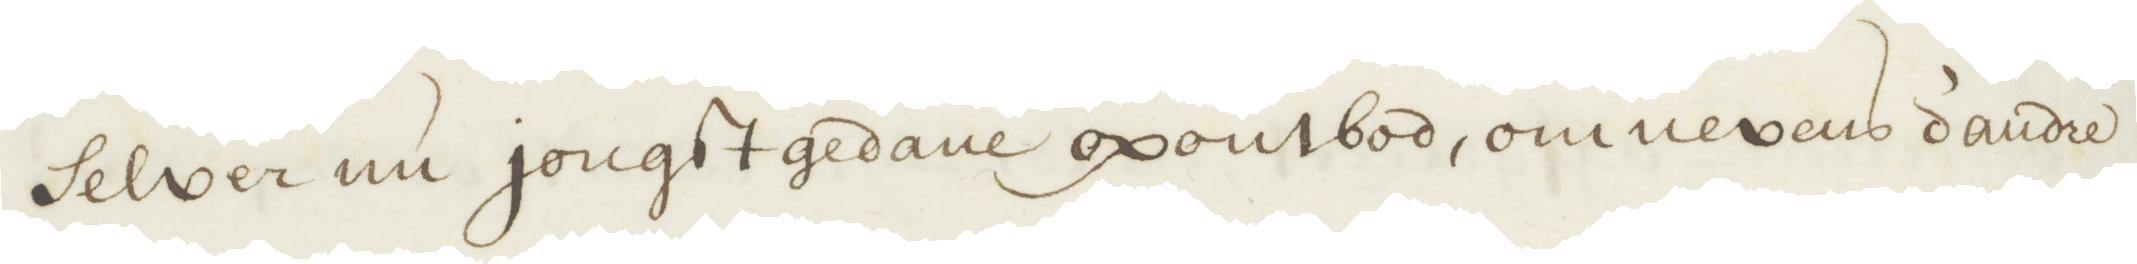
selver nu jongst gedane opontbod, om nevens d'andre
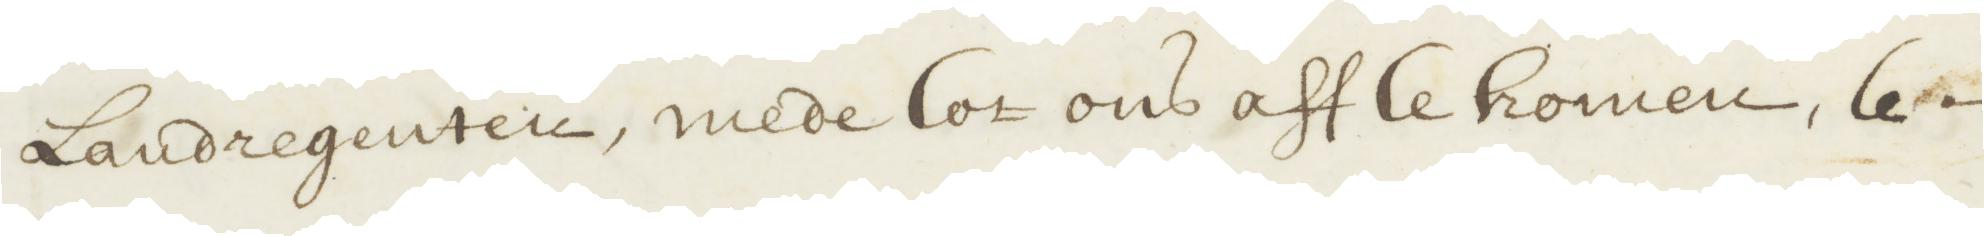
landregenten, mede tot ons aff te komen, te
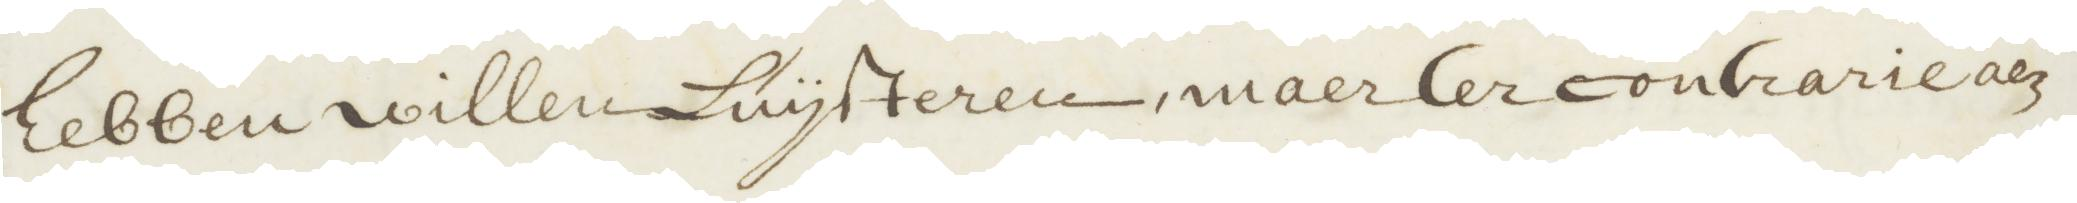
hebben willen luijsteren, maer ter contrarie aen
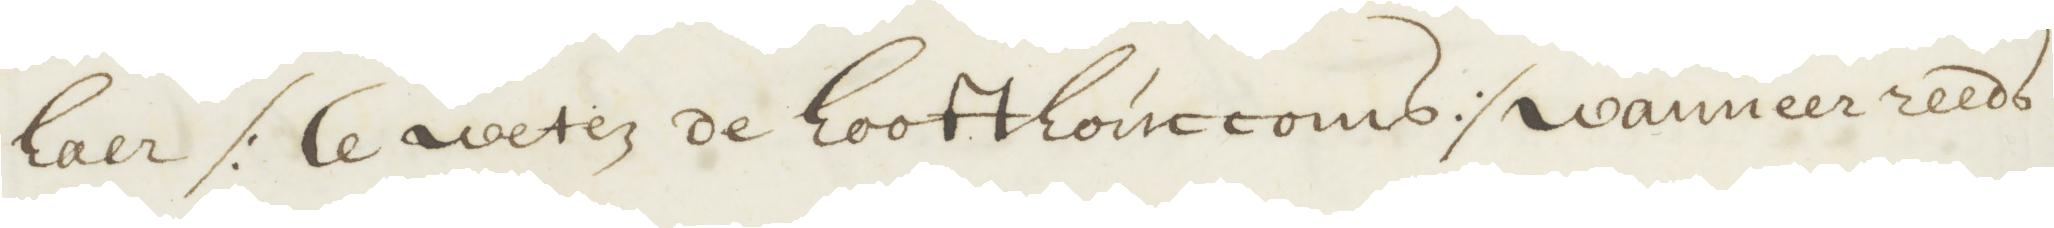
haer /:te weten de hoofthouccoms:/ wanneer reeds
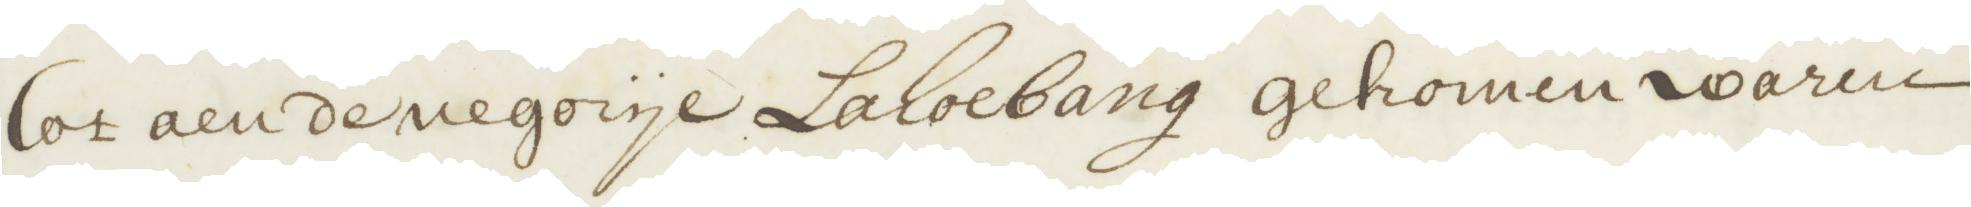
tot aen de negorije Lahoebang gekomen waren
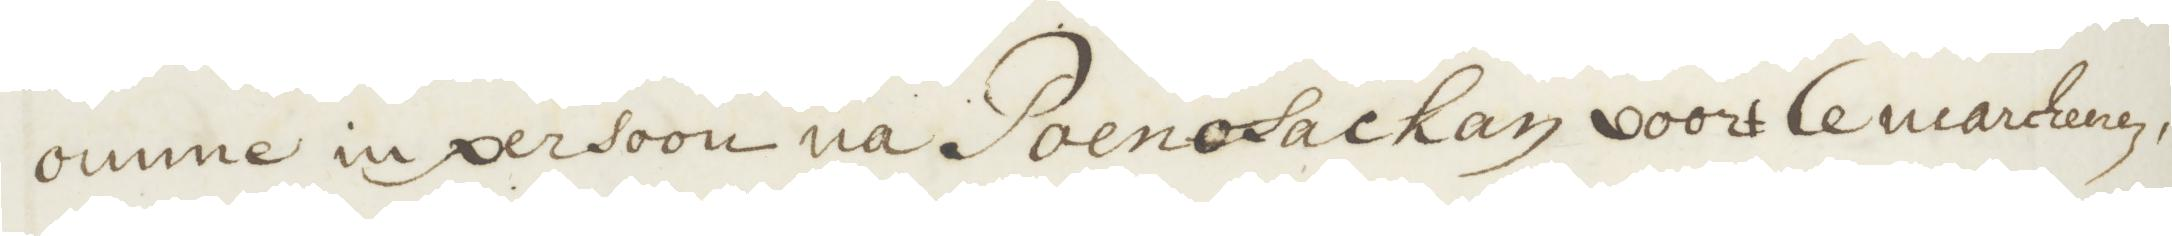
omme in persoon na Poenosackan voort te marcheeren,
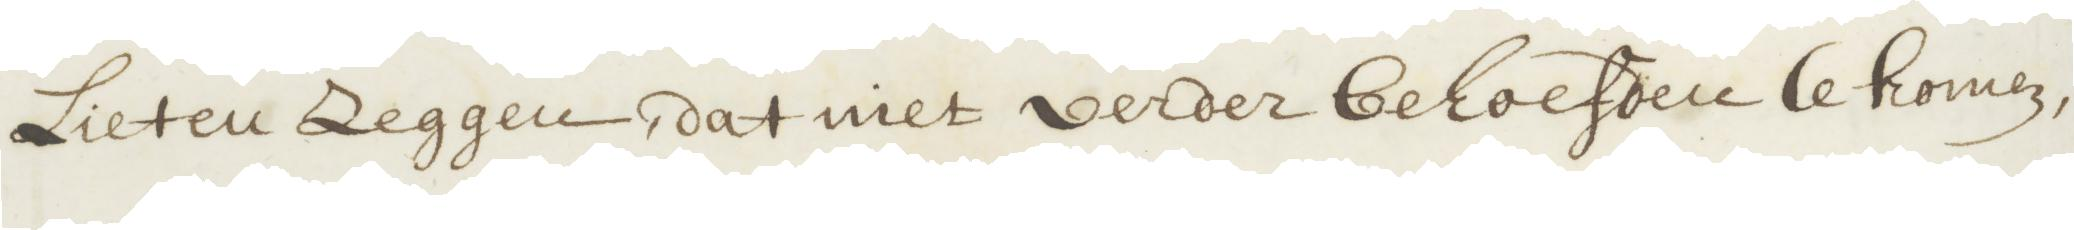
lieten zeggen, dat niet verder behoefden te komen,
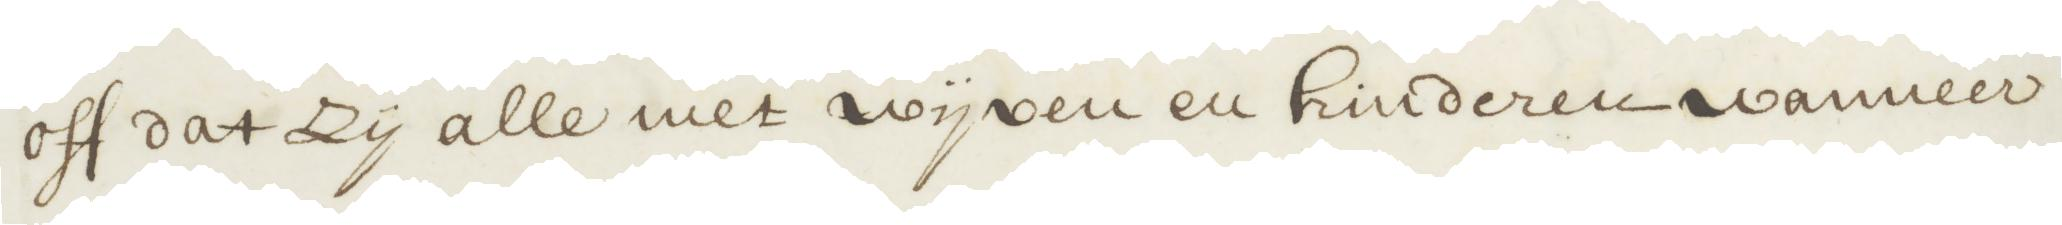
off dat zij alle met wijven en kinderen wanneer
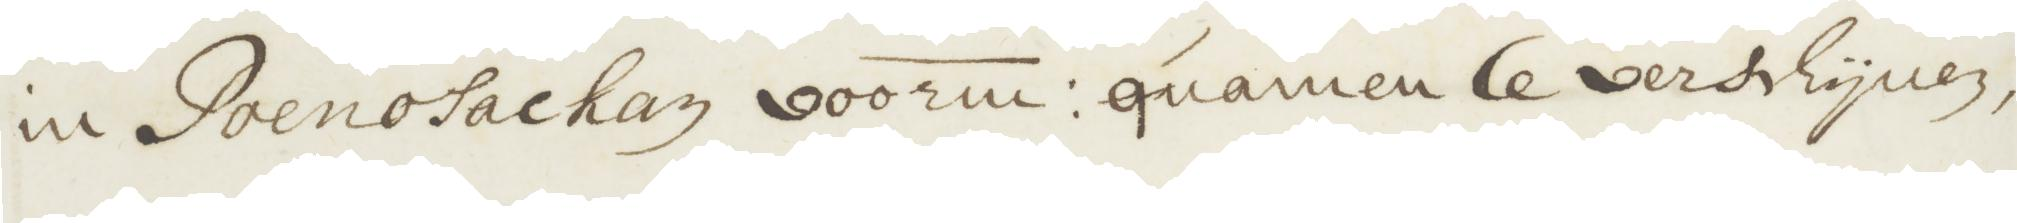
in Poenosackan voorm: quamen te verschijnen,
